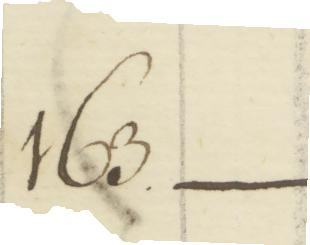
163. —
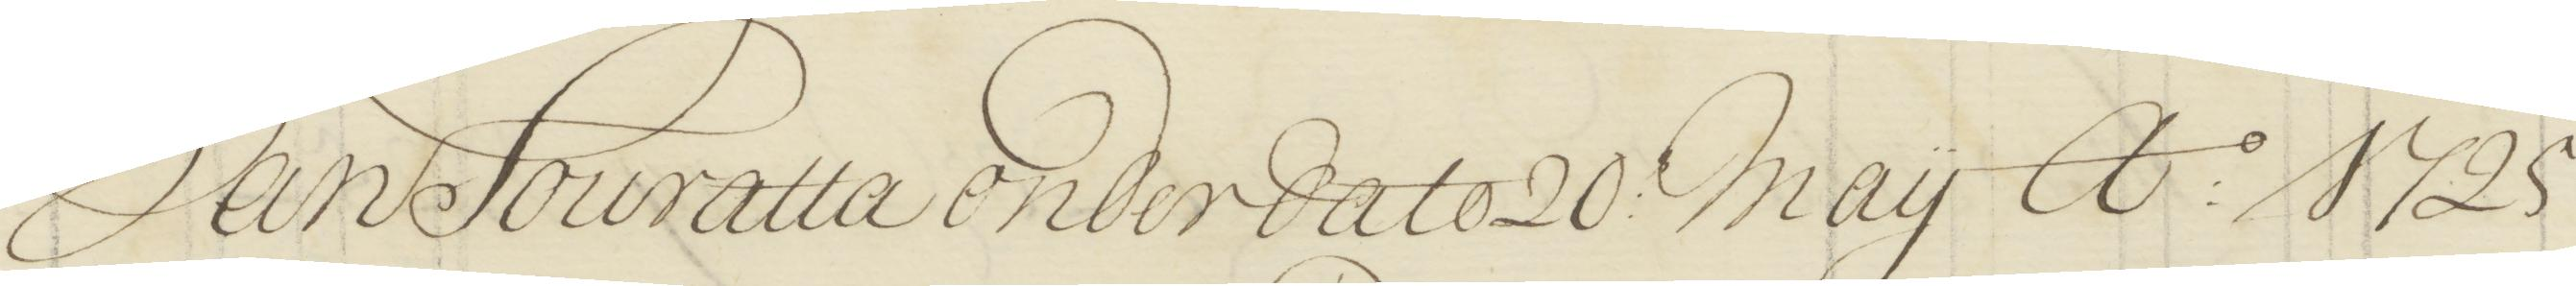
Van Souratta onder dato 20:en Maij A:o 1725
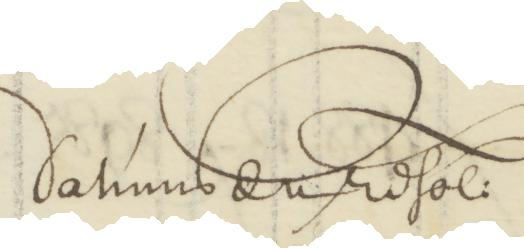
Datums der resol:
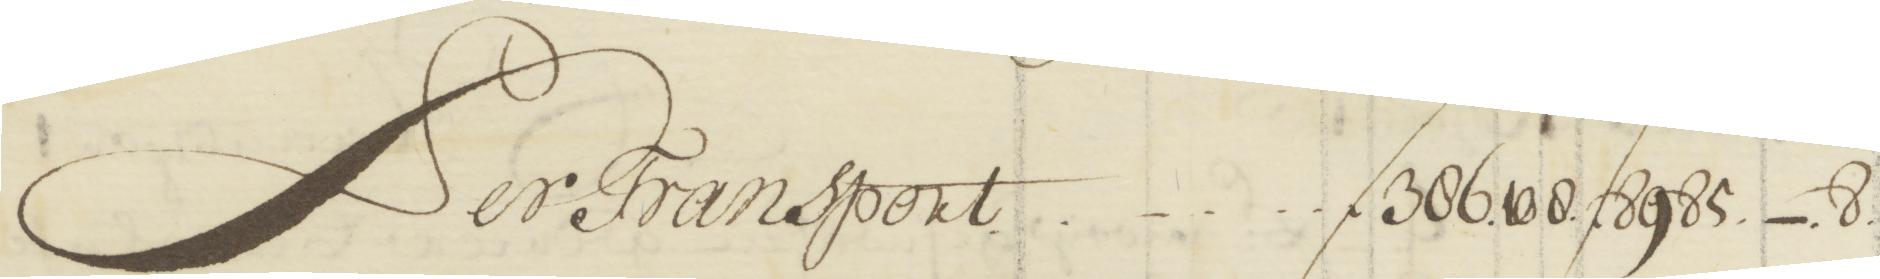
Per Transport. - - - - - ƒ 386. 10 8. ƒ 8985. —. 8.
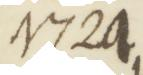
1724
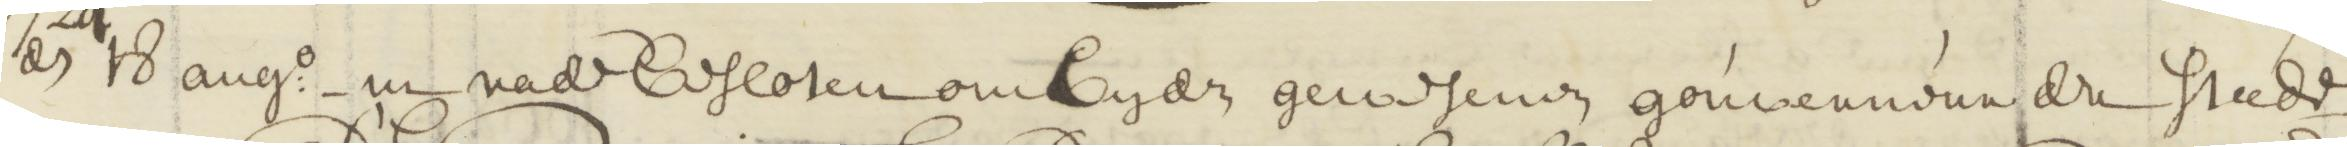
den 18 aug:o - in rade besloten om Byden gewesenen gouverneur der steede
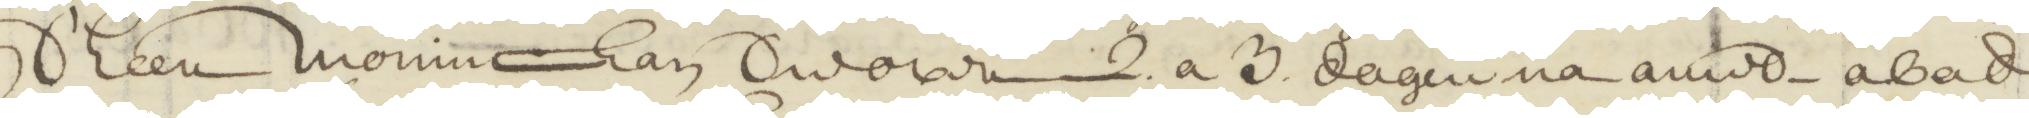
d’ heer Moninchan dieover 2. a 3. dagen na amed - abad
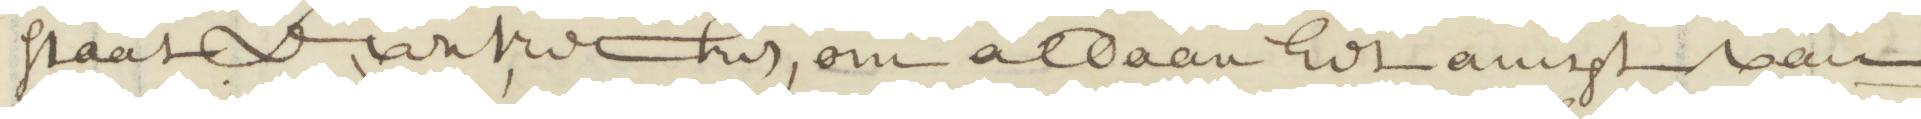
staat te vertrecken, om aldaar het ampt van
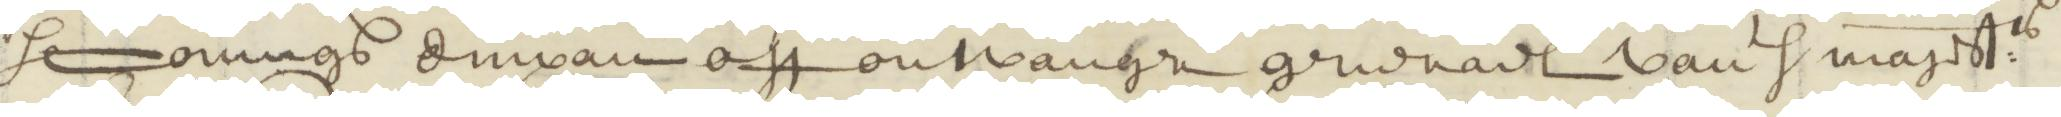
sConings duwan off ontvanger generael van 's majest:ts
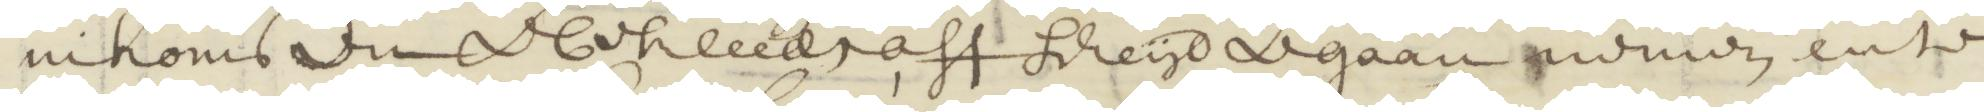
inkomsten tebekleeden affscheijd tegaan nemen en te
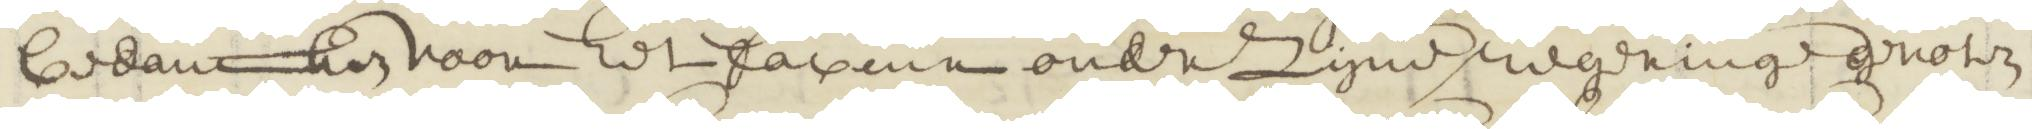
bedancken Voor het faveur onder zijne regeringe genoten
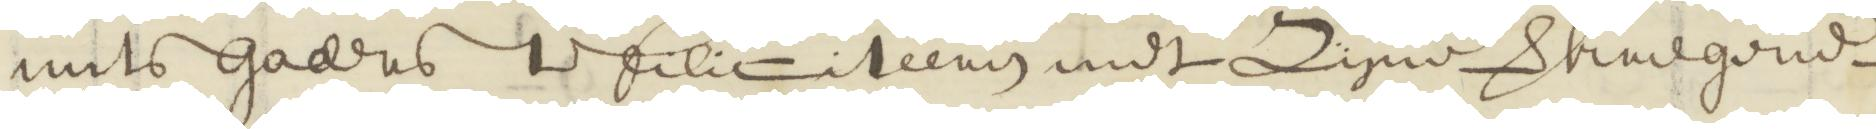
mitsgaders te filiciteeren met zijne verkregene —
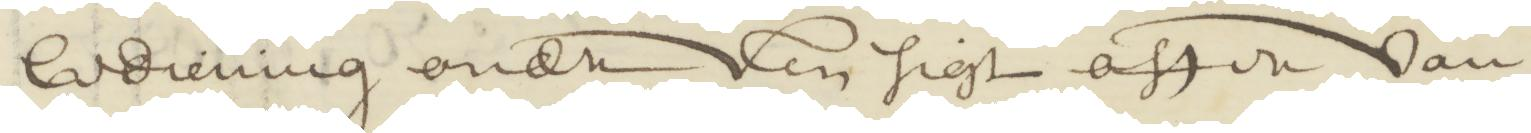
bediening onder Een sigt offer Van
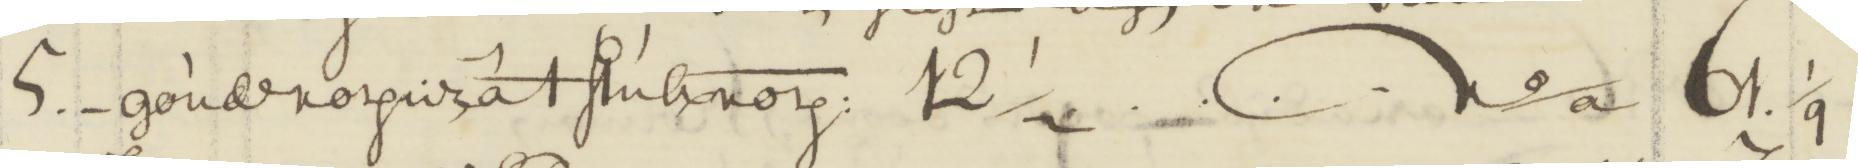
5. — gouderopien at stuk rop: 12½ - - - - R/ao 61. ¼
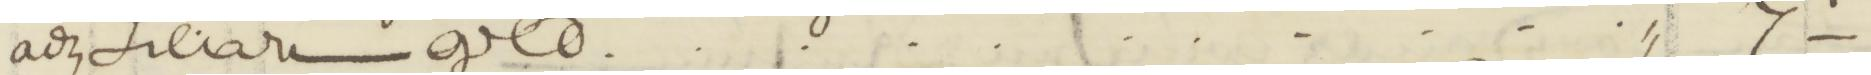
aen silver geld - - - - - - - - - - - „ 7 —
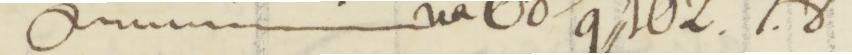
— ra 68¼ „ 102. 7. 8
